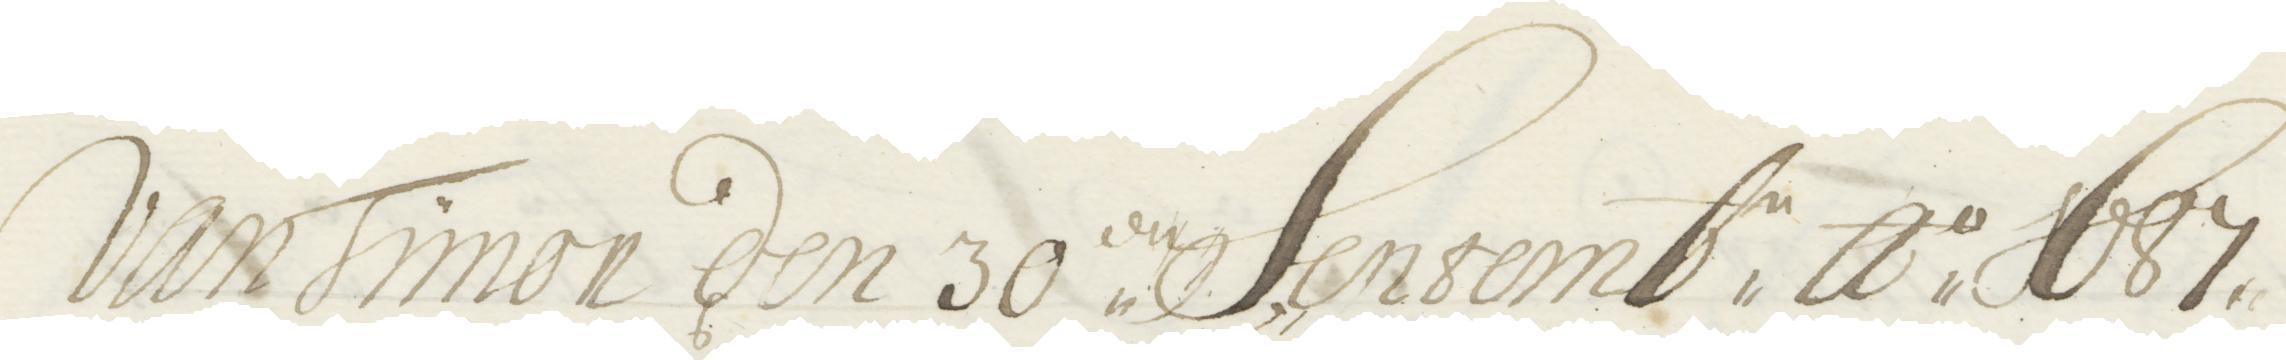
Van Timor den 30:en Septemb„r A„o 1687.
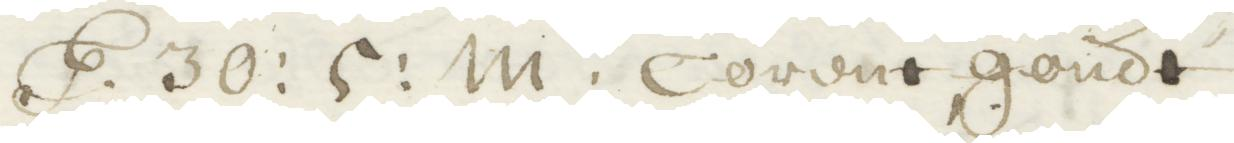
J. 30: 5: M.s Corent goudt
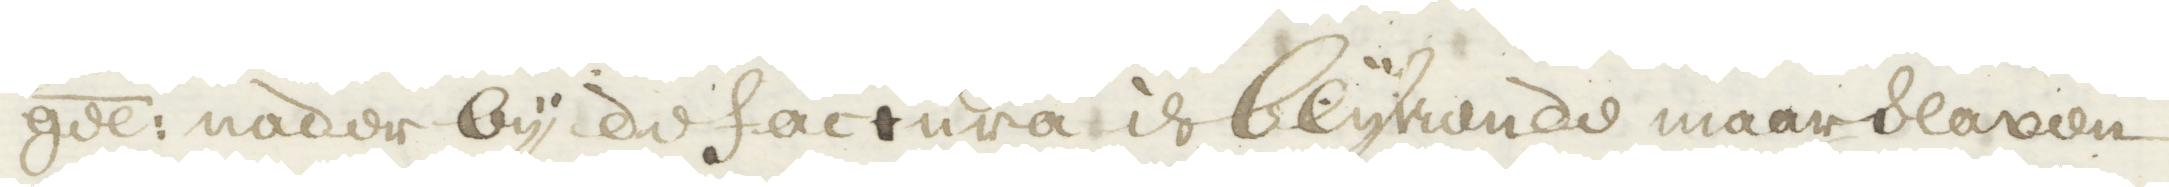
gel: nader bij de factura is blijkende maar slaven
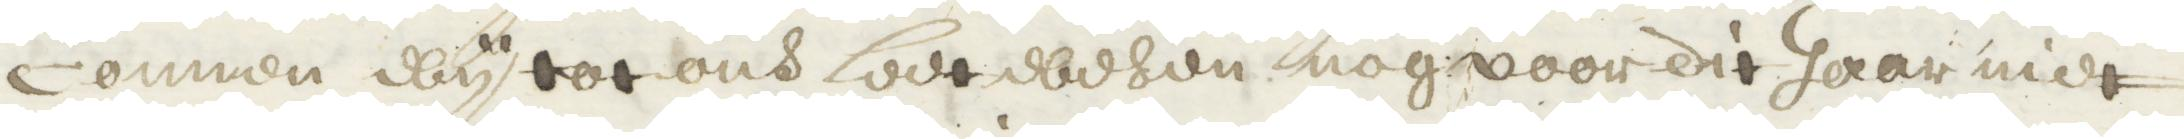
connen wij tot ons leetwesen nog voor dit Jaar niet
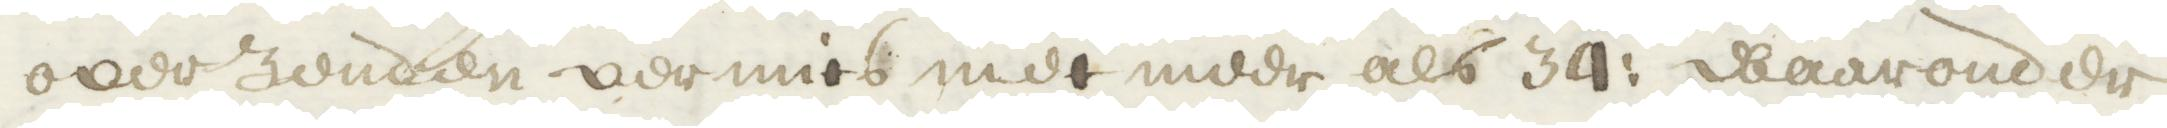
overzenden vermits niet meer als 34: waaronder
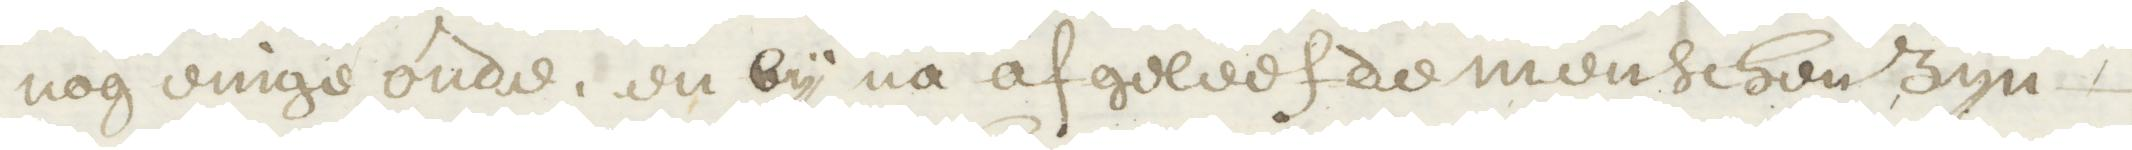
nog enige oude, en bij na afgeleefde menschen zijn
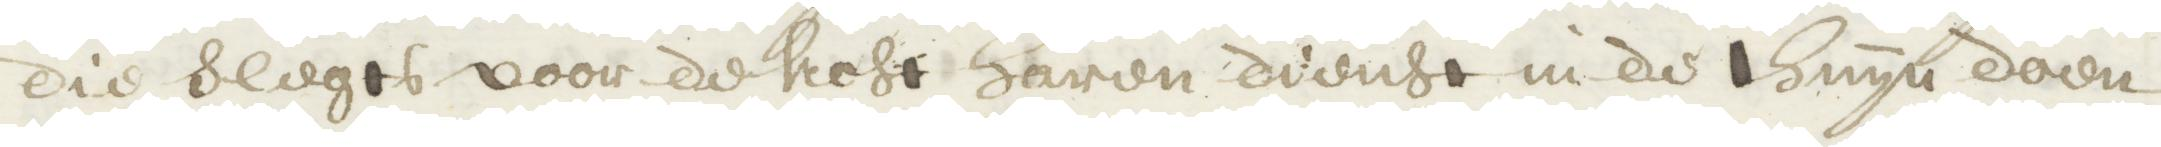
die slegts voor de kost haren dienst in de thuijn doen
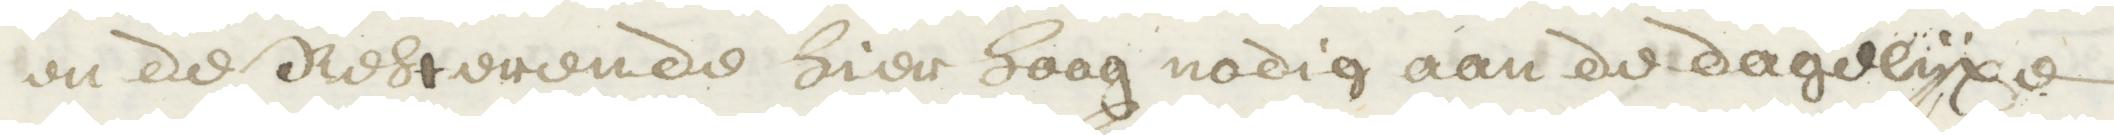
en de Resterende hier hoog nodig aan de dagelijxe
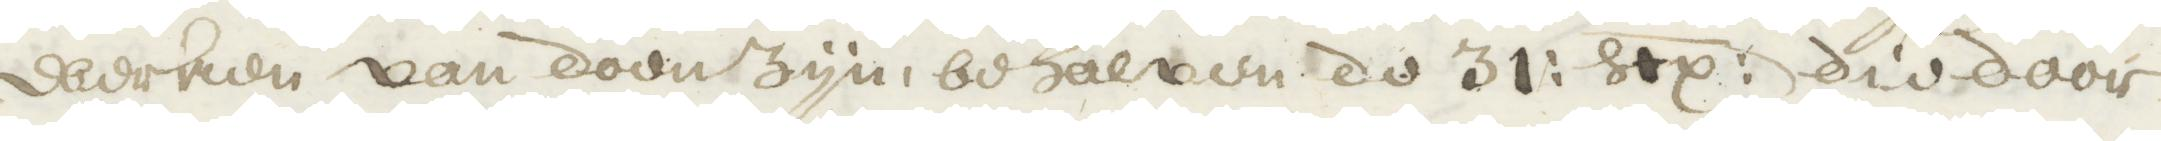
werken van doen zijn, behalven de 31: stx: die door
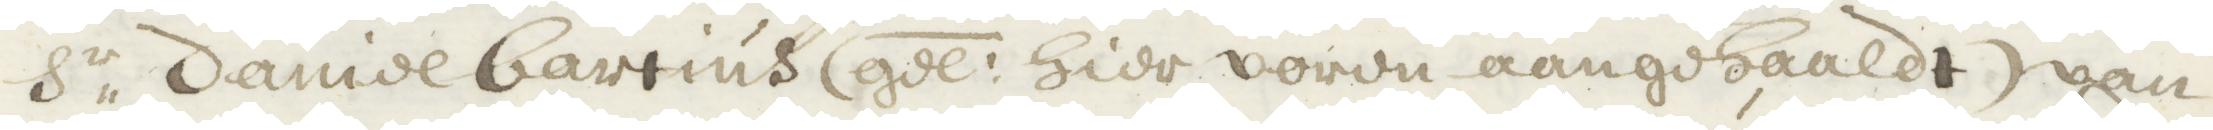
s„r daniel bartius (gel: hier voren aangehaaldt) van
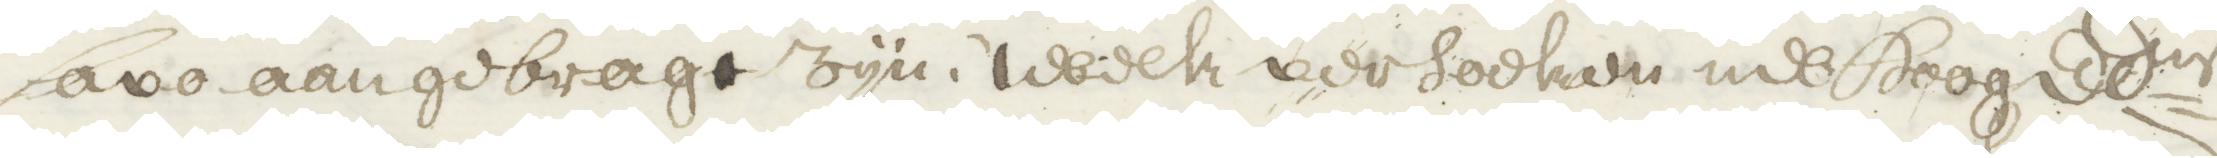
favo aangebragt zijn. 'twelk versoeken uEb Hoog Ed=m
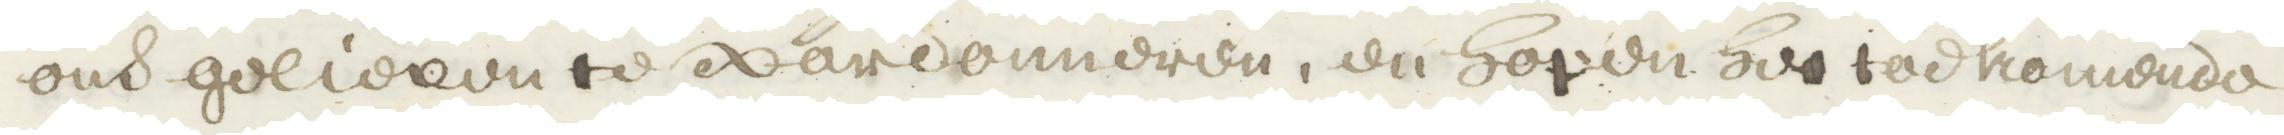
ons gelieven te pardonneren, en hopen het toekomende
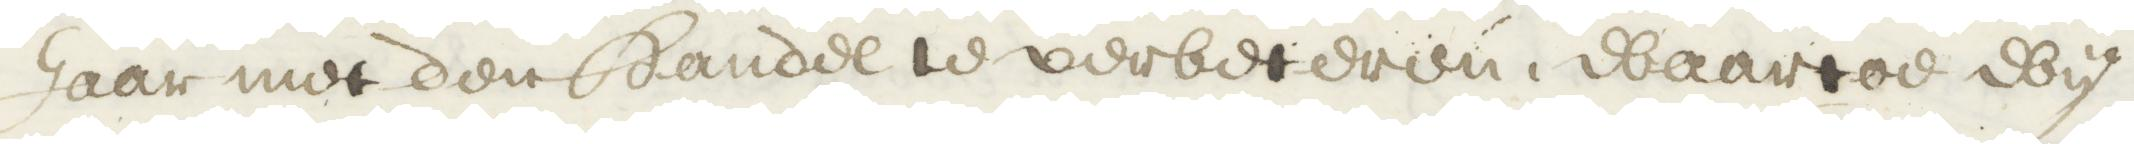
Jaar met den Handel te verbeteren, waartoe wij
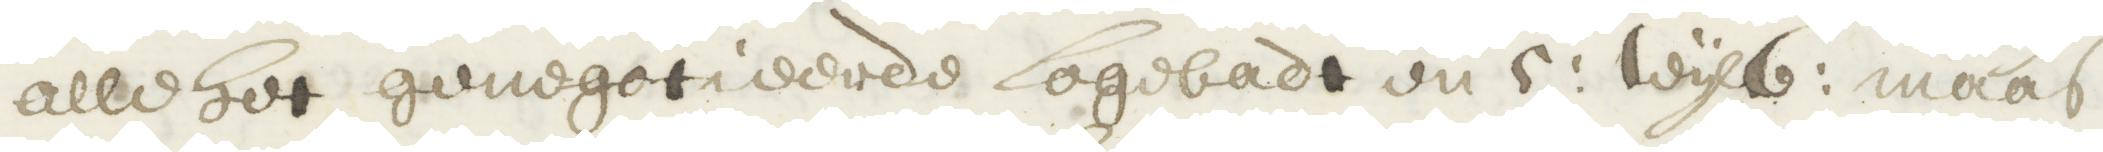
alle het genegotieerde logebadt en 5: teijls: maas
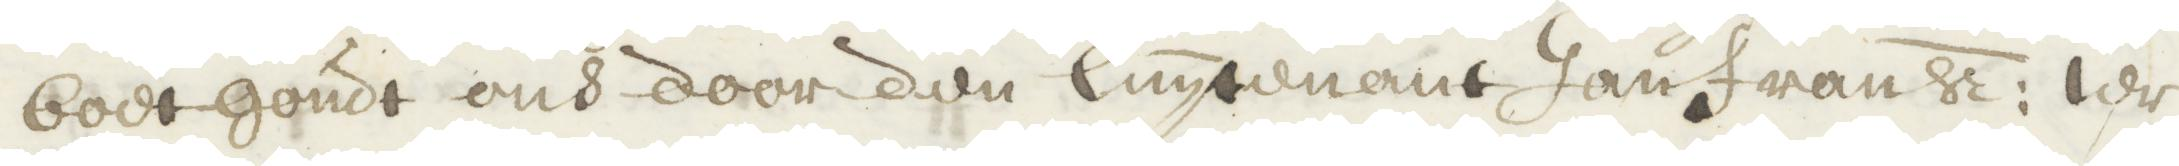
boetgoudt ons door den luijtenant Jan Fransz: ter
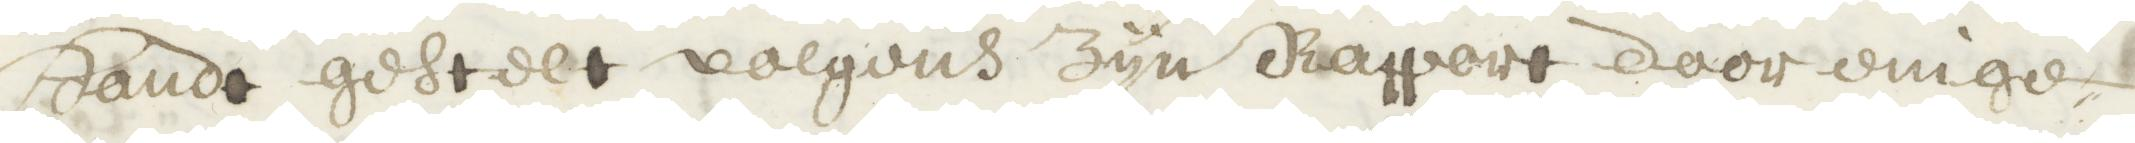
Handt gestelt volgens zijn Rapport door enige„
